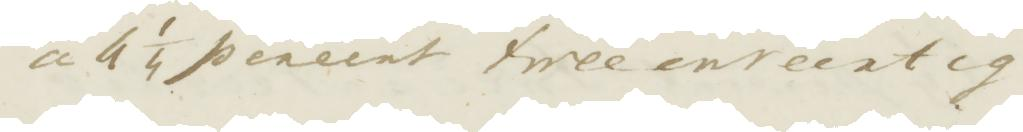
a 4¼ percent twee en veertig
